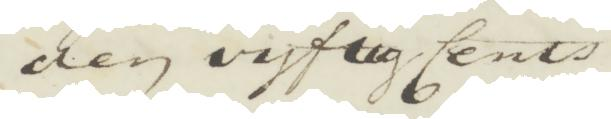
den vyftig Cents
